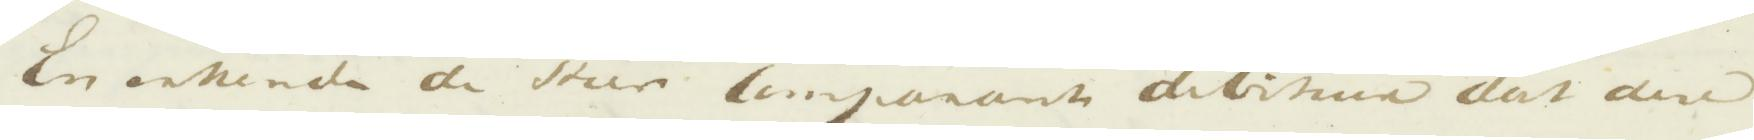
En erkende de Heer Comparant debiteur dat deze
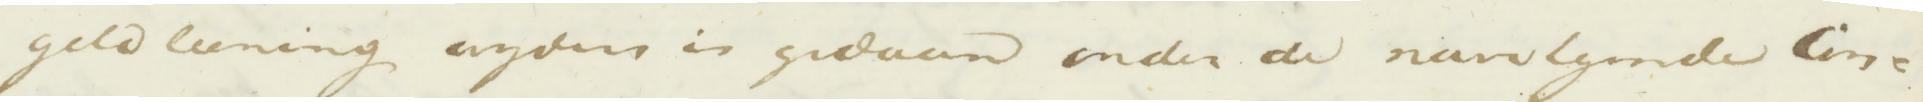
geldleening wyders is gedaan onder de navolgende Con=
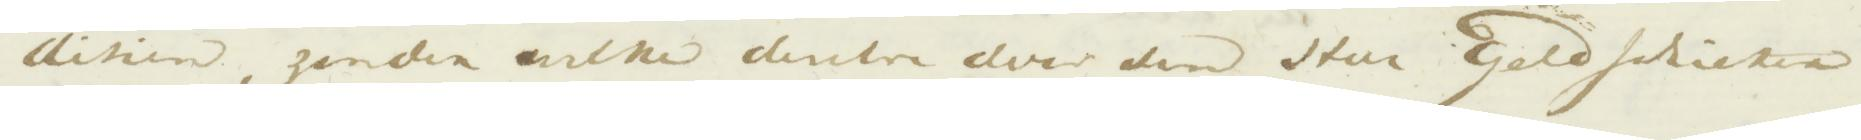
ditien, zonder welke deselve door den Heer Geldschieter
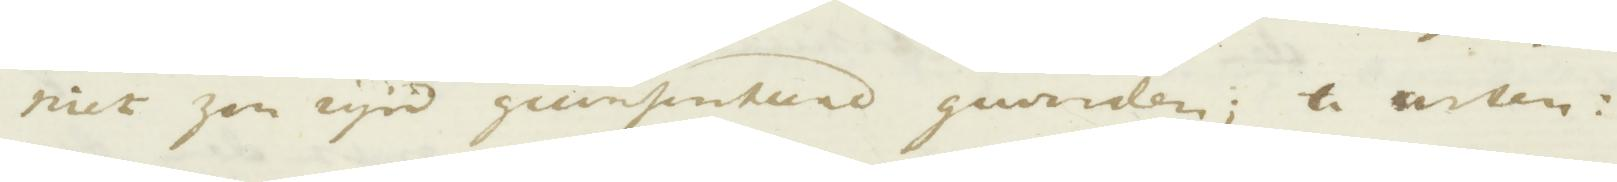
niet zin zijn geconsenteerd geworden; te weten:
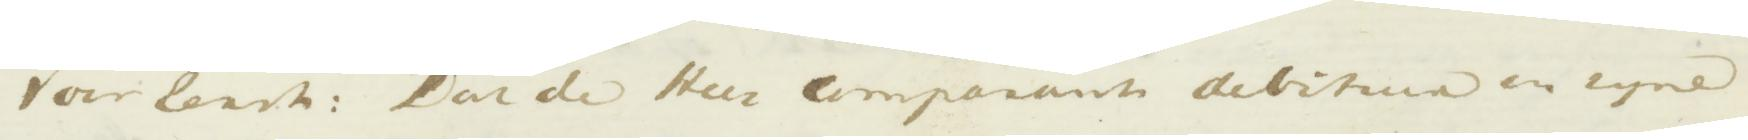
Voor Eerst: Dar de Heer comparant debiteur en zyne
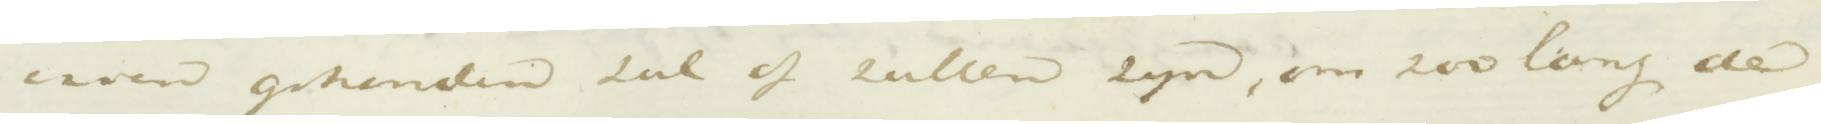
erven gehouden zal of zullen zyn, om zoo lang de
